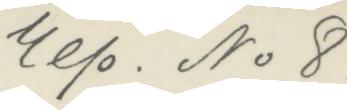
rep. No 8
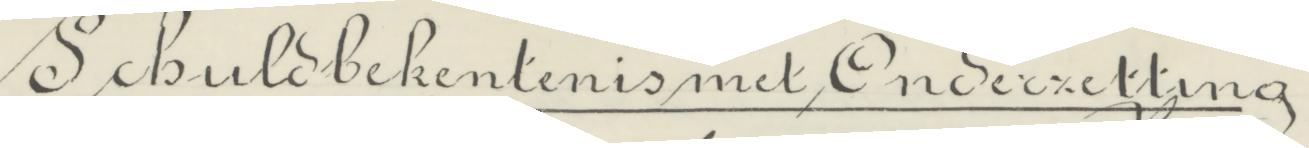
Schuldbekenlenis met Onderzetting
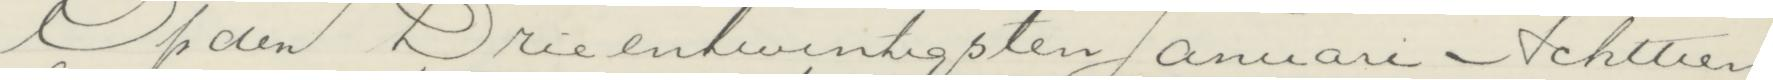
Op den Drie en twintigsten Januari Achttien
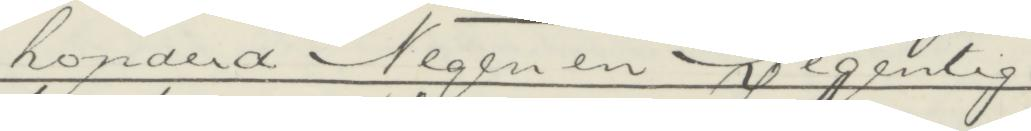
honderd Negen en Negentig
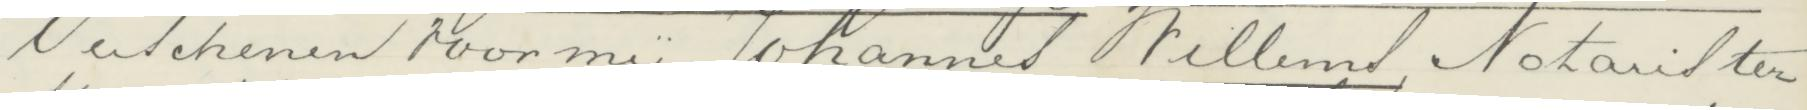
Verschenen voor mij Johannes Willems, Notaris ter
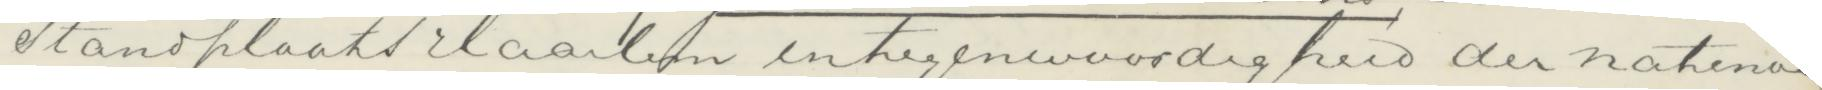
standplaats Haarlem, in tegenwoordigheid der natenoe
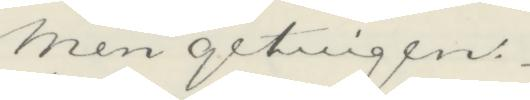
men getuigen.
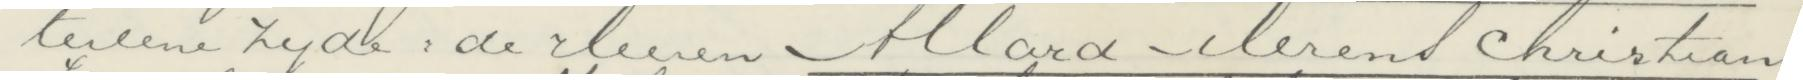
tereene zyde: de Heeren Allard Merens christian
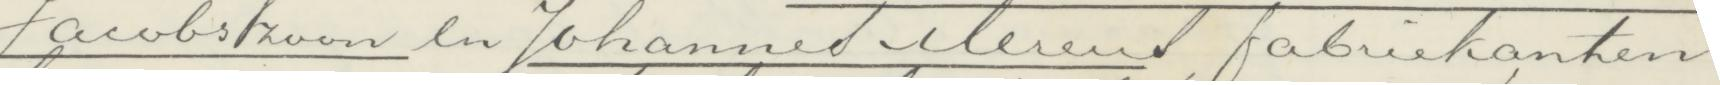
Jacobszoon en Johannes Merens, frabrikant en
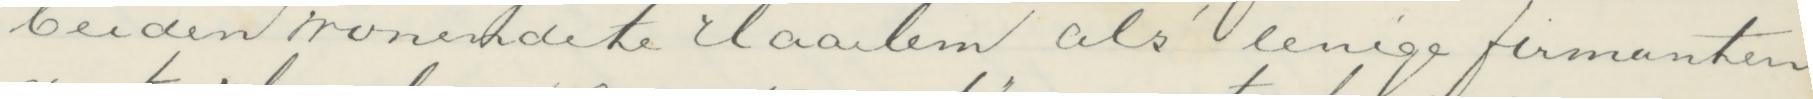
beiden wonende te Haarlem als eenige firmanten
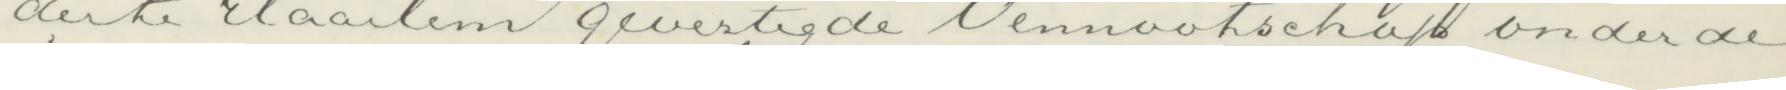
der te Haarlem gevestigde Vennootschap onder de
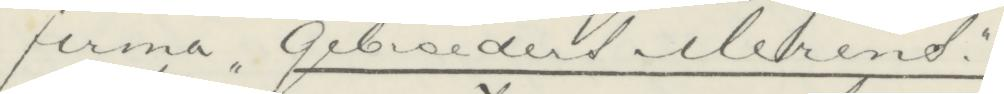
firma „Gebroeders Merens.”
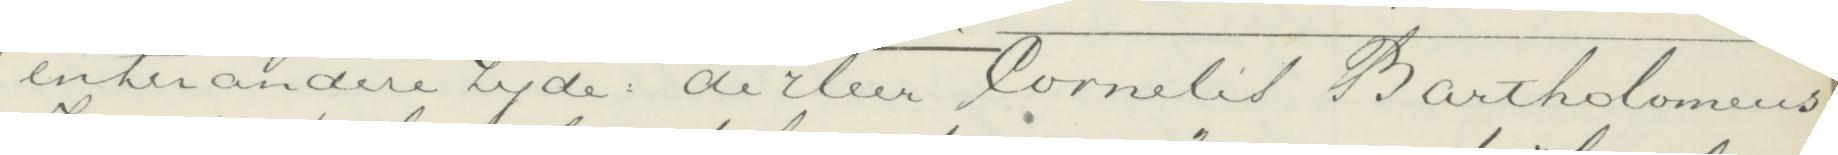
en ter andere zyde de Heer Cornelis Bartholomeus
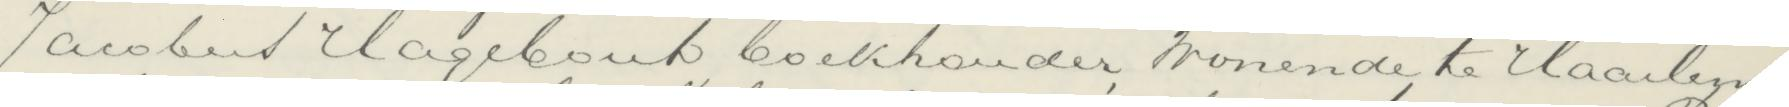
Jacobus Hagebout, boekhouder, wonende te Haarlem
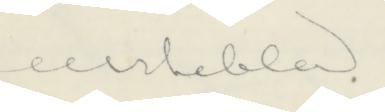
eenheblen
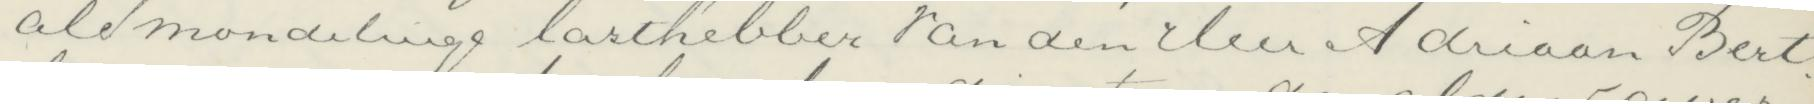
als mondelinge lasthebber van den Heer Adriaan Bert,
